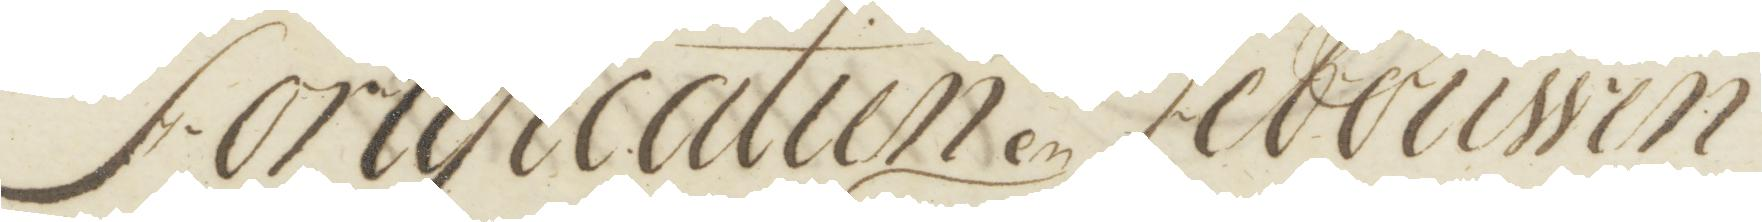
Fortificatien en Gebouwen
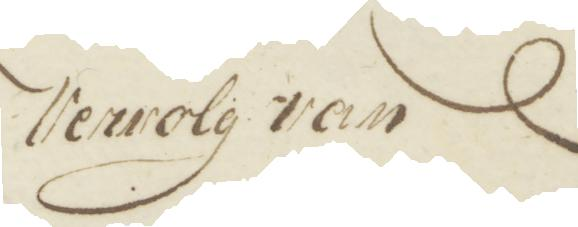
Vervolg van
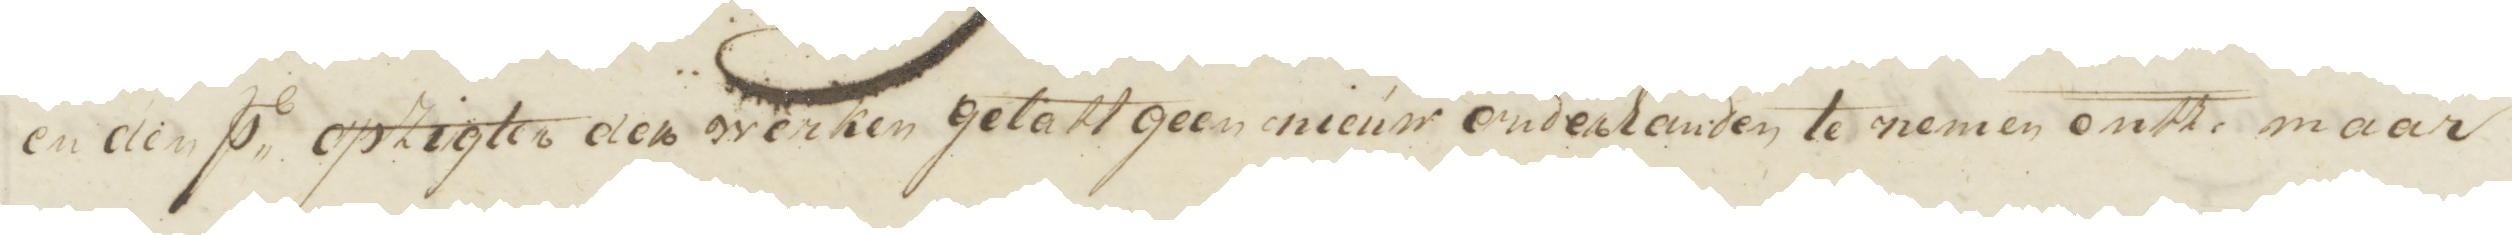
en den p„b opzigter der werken gelast geen nieuw onderhanden te nemen ontz: maar
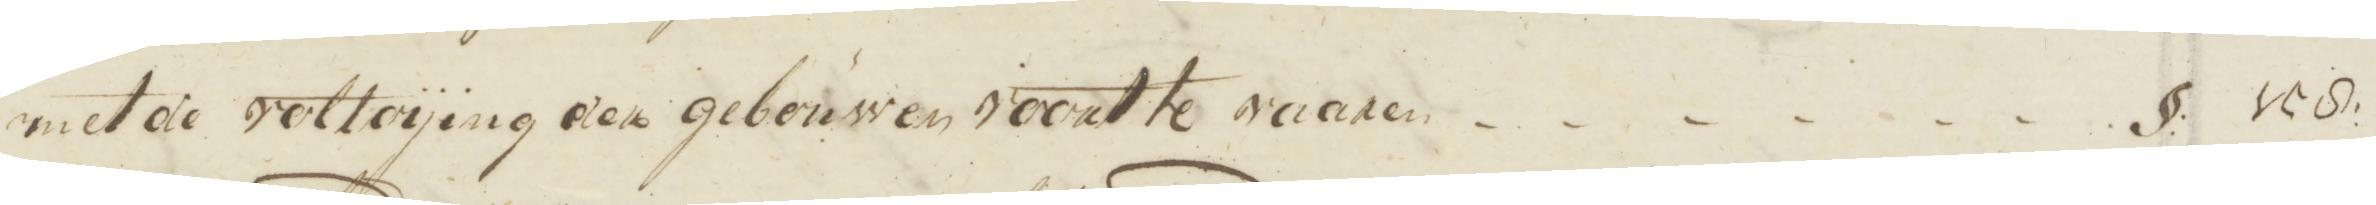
met de voltoijing der gebouwen voort te vaaren - - - - - - §: 158:
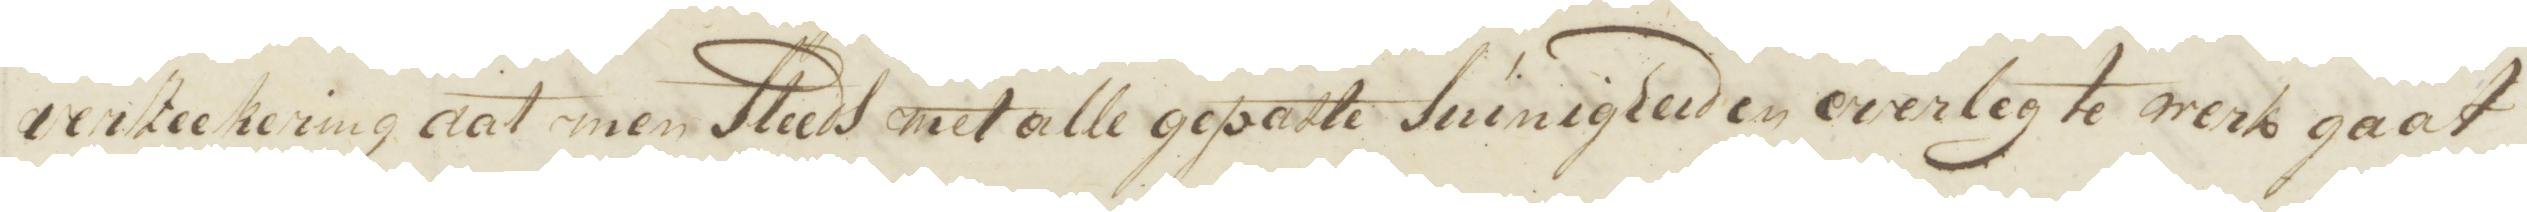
verzeekering dat men steeds met alle gepaste suinigheid en overleg te werk gaat
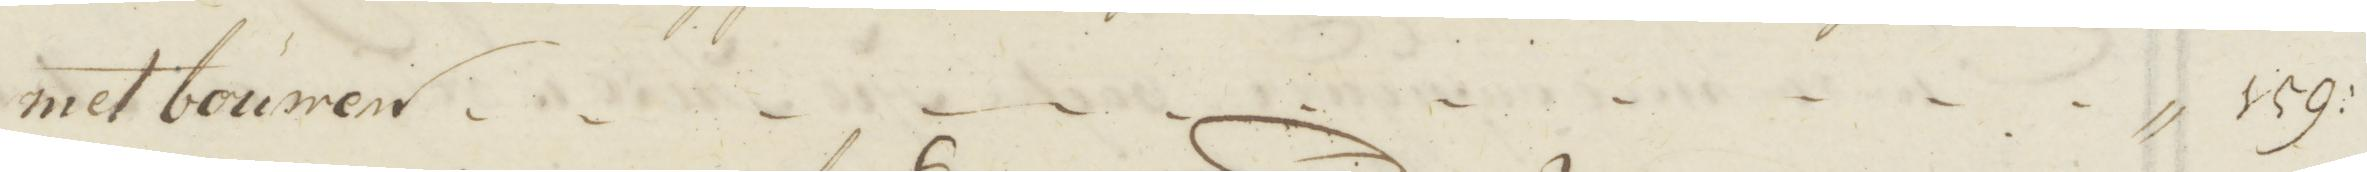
met bouwen - - - - - - - - - - - - „ 159:
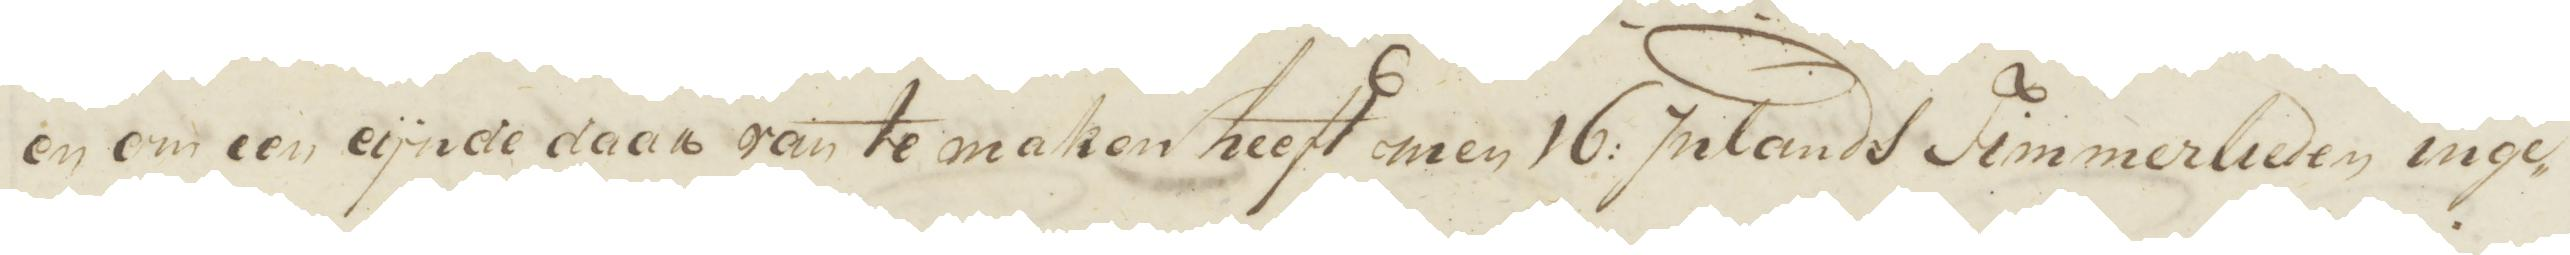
en om een eijnde daar van te maken heeft men 16: Jnlands Timmerlieden inge„
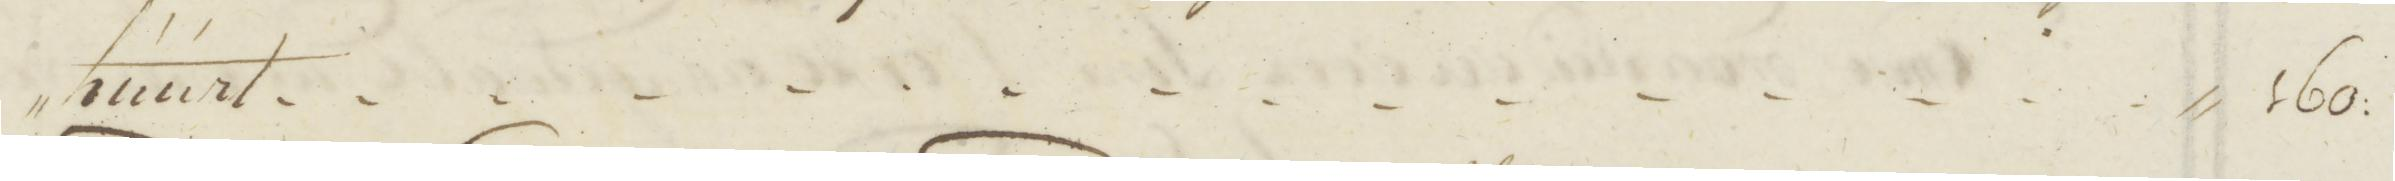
„huurt - - - - - - - - - - - - - - - - „ 160:
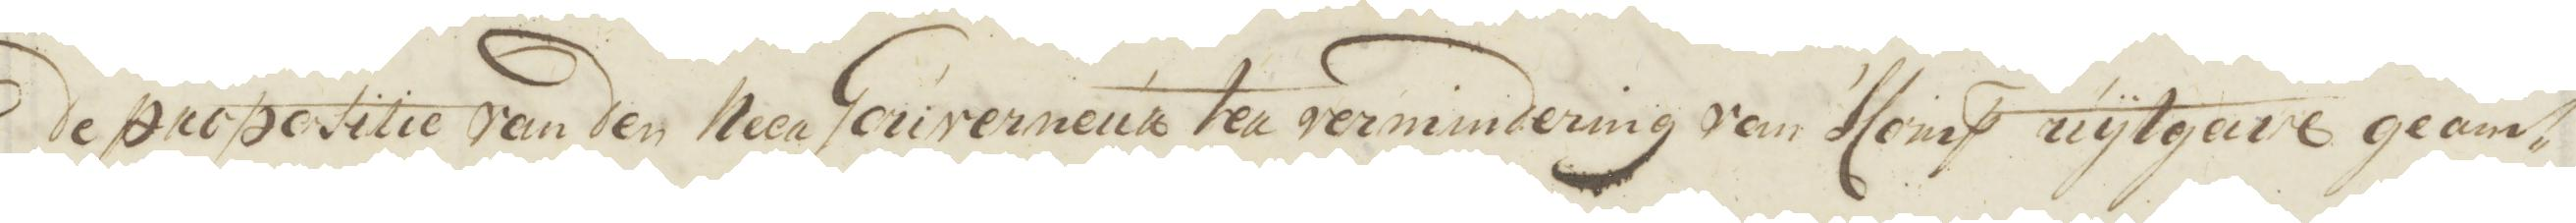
de propositie van den heer Gouverneur ter vermindering van ’sComp uijtgave geam„
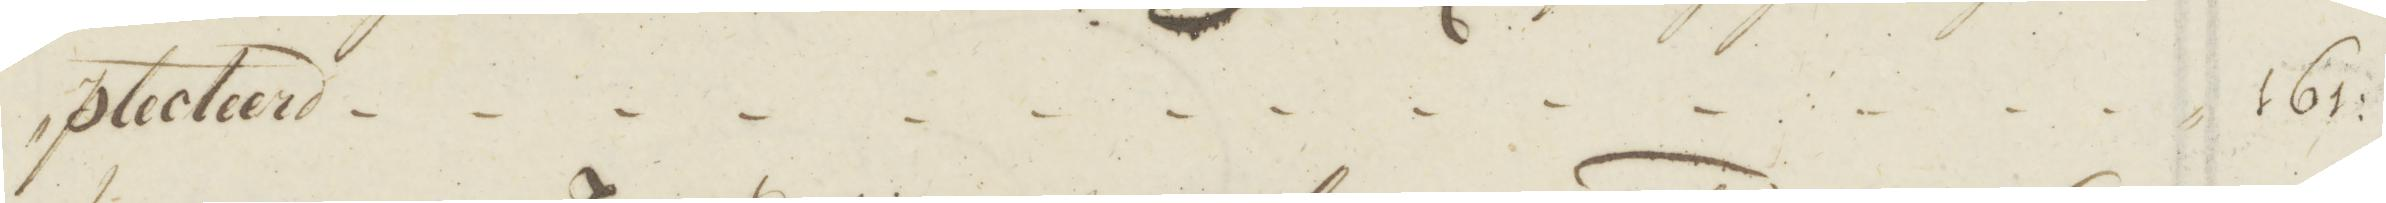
„plecteerd - - - - - - - - - - - - - - „ 161:
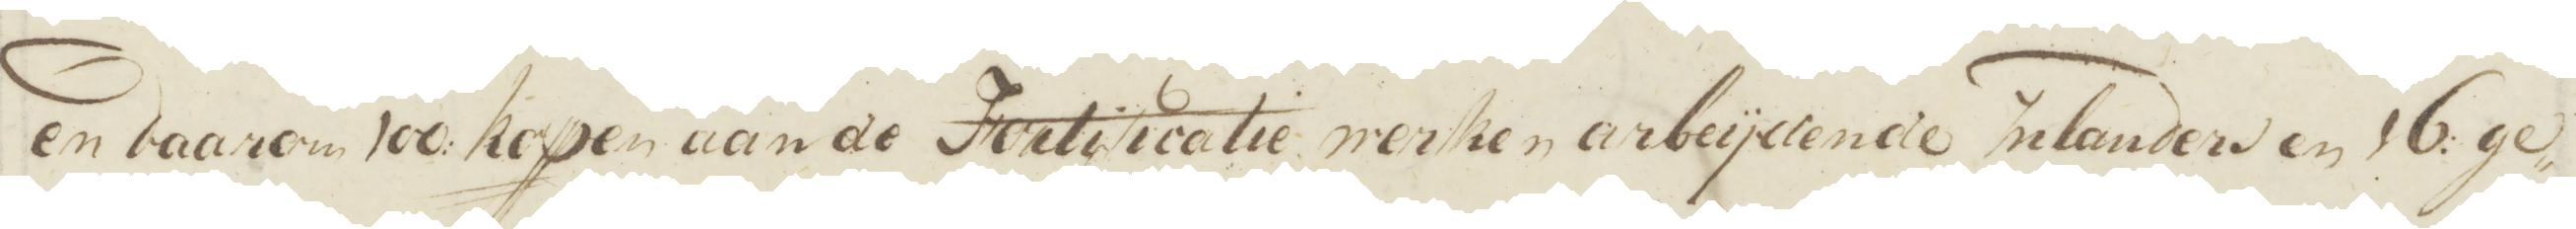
en daarom 100: koppen aan de Fortificatie werken arbeijdende Jnlanders en 16: ge„
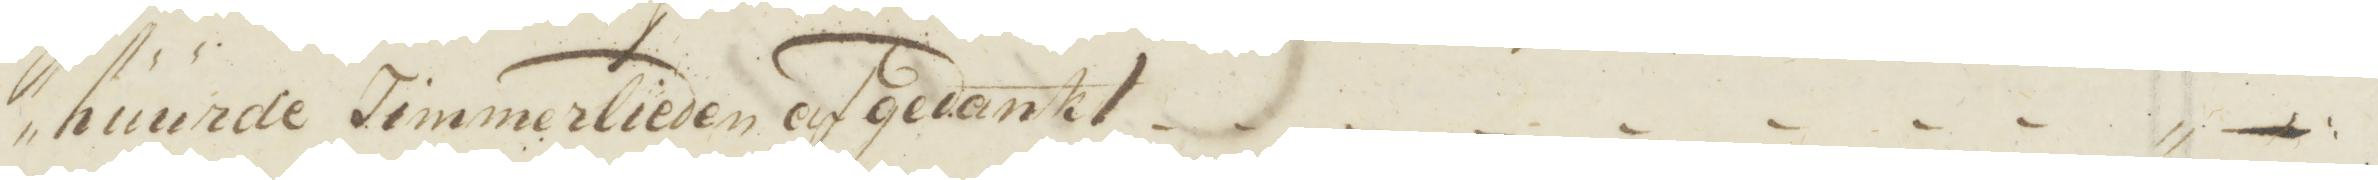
„huurde Timmerlieden afgedankt - - - - - - - - „ —:
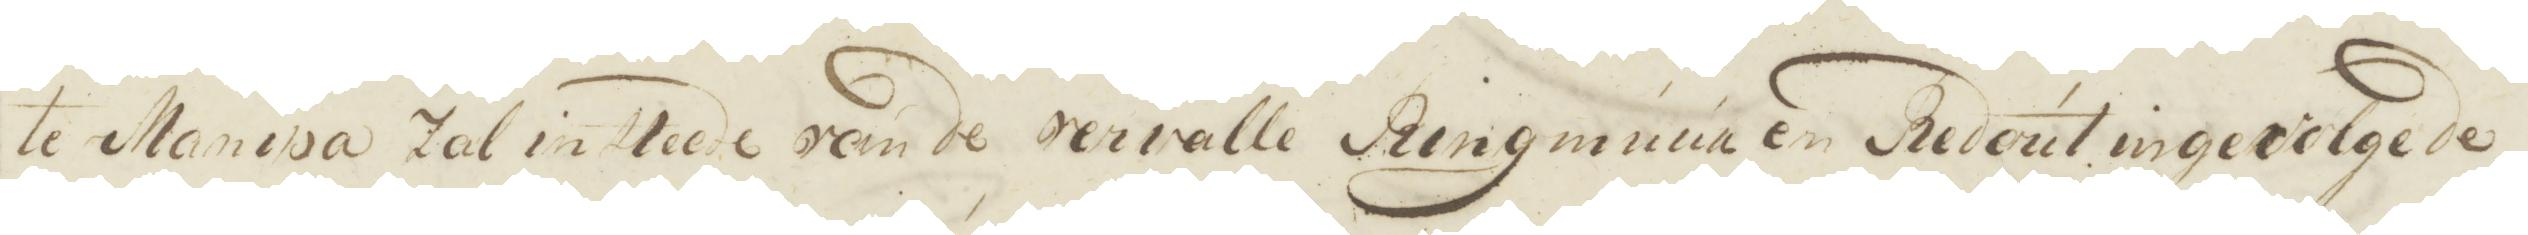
te Manipa zal in steede van de vervalle Ringmuur en Redout ingevolge de
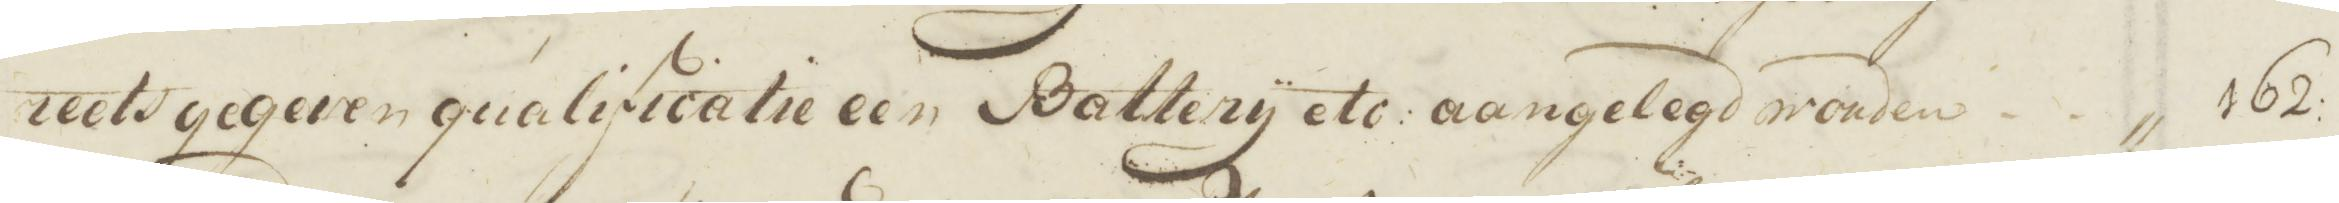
reets gegeven qualificatie een Batterij etc: aangelegd worden - - „ 162:
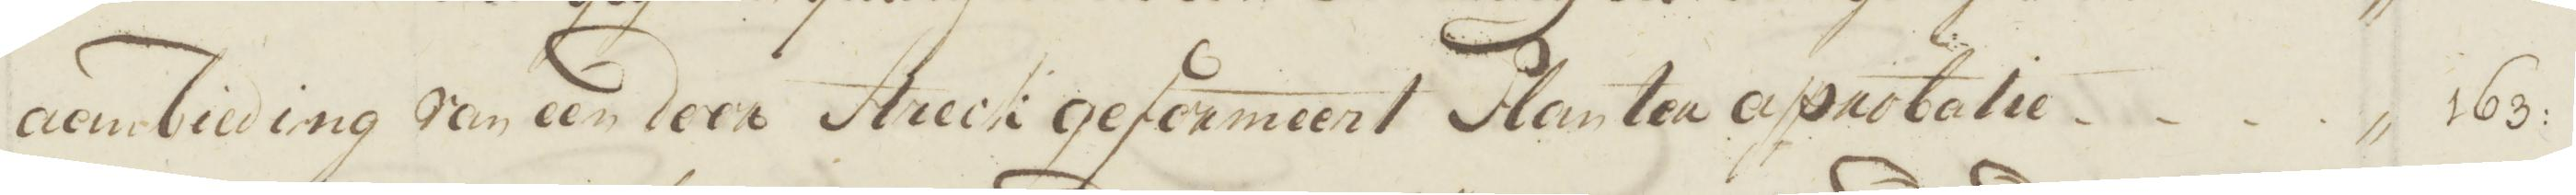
aanbieding van een door Streck geformeert Plan ter approbatie - - - - „ 163:
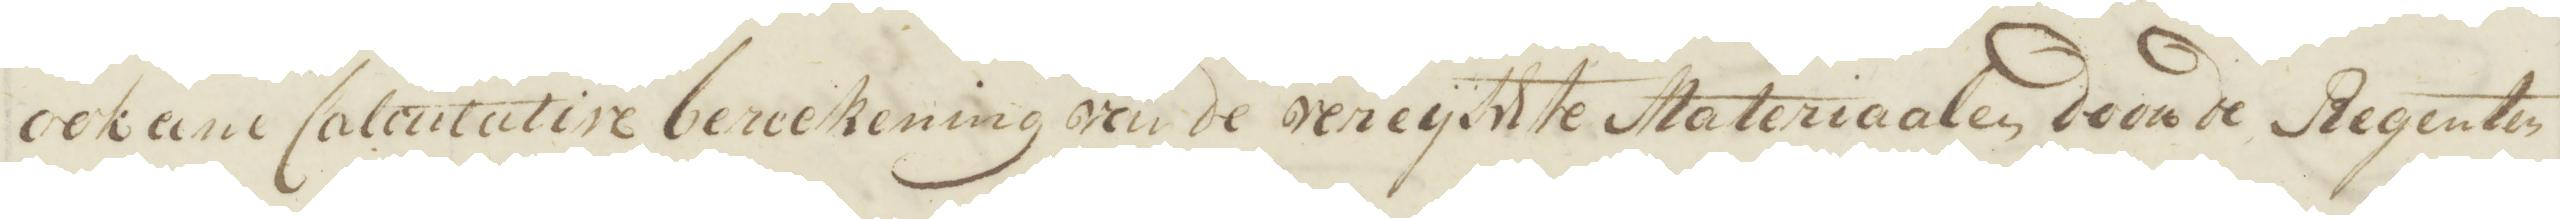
ook eene calculative bereekening van de vereijschte Materiaalen door de Regenten
